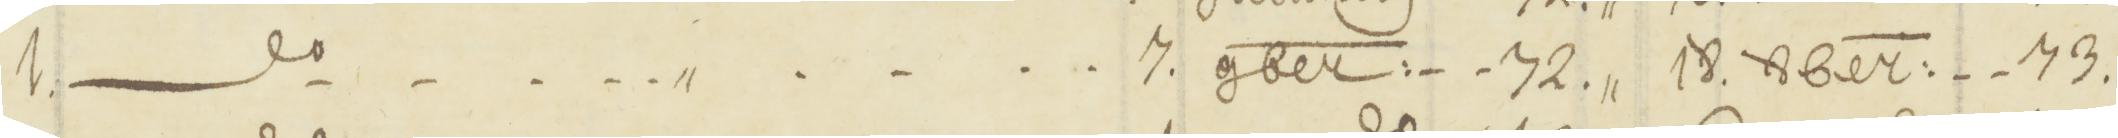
1. _o.....„....7 gber:.. 72„ 18. 8ber:... 73.
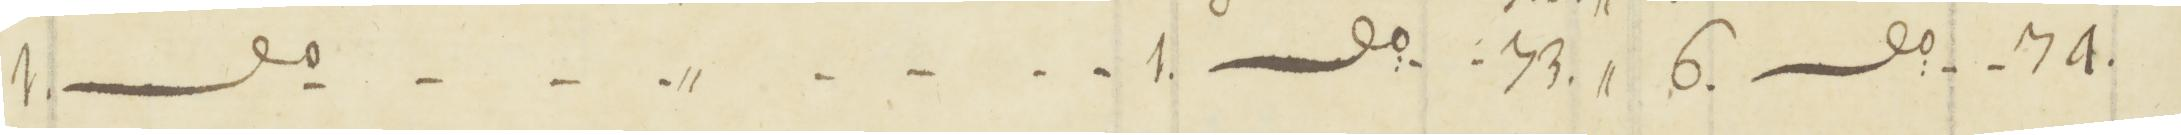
1. _o.....„....1. _:o... 73 „ 6 _:o 74.
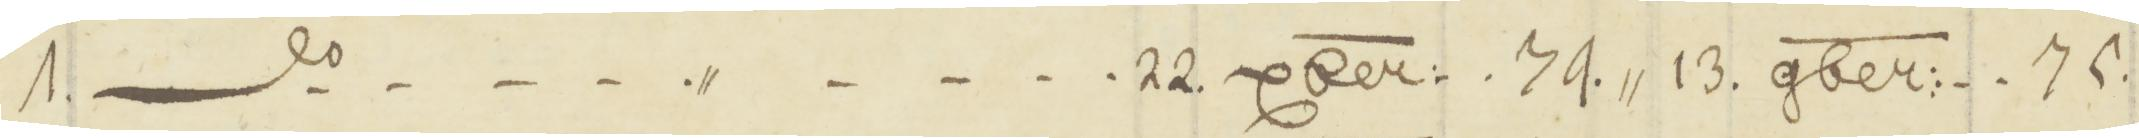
1. _o.....„....22 xber: 74. „13. gber: 75.
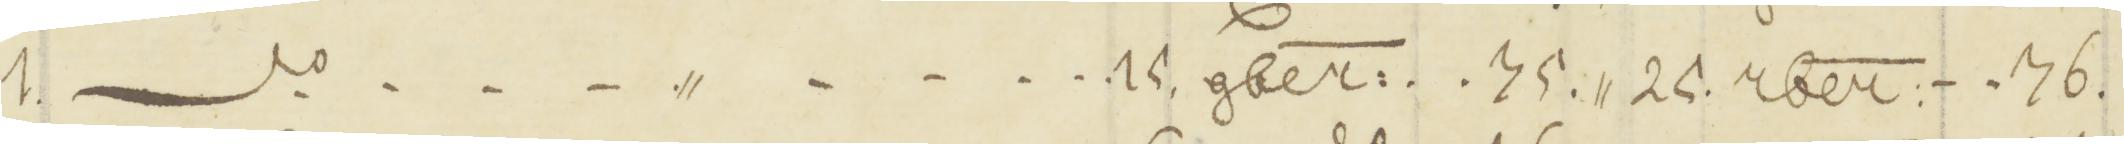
1. _o.....„....15. gber: 75. „ 25. rber: 76.
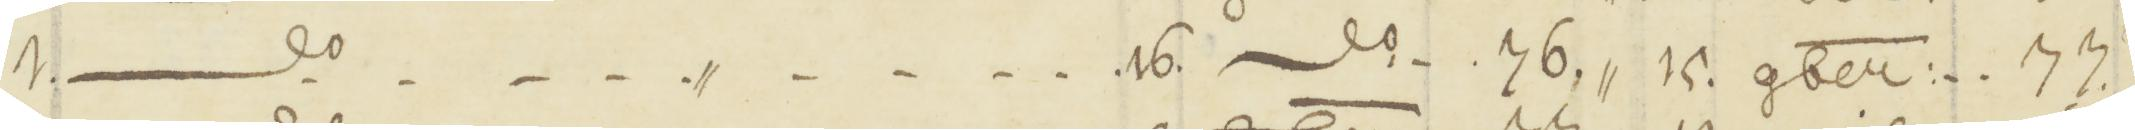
1. _o.....„....16. _o 76. „ 15. gber: 77
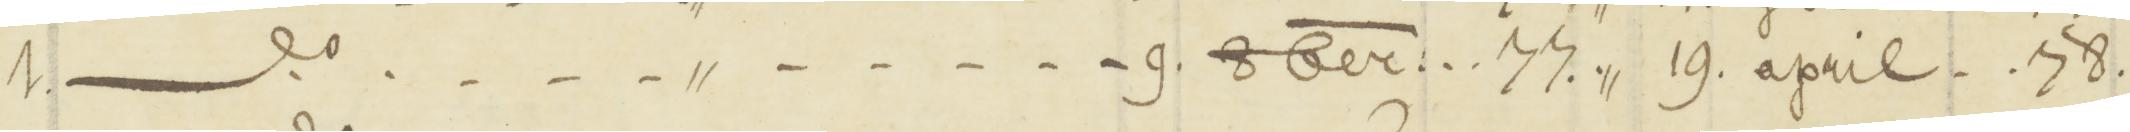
1. _o.....„....9. 8ber: 77. „ 19. april 78.
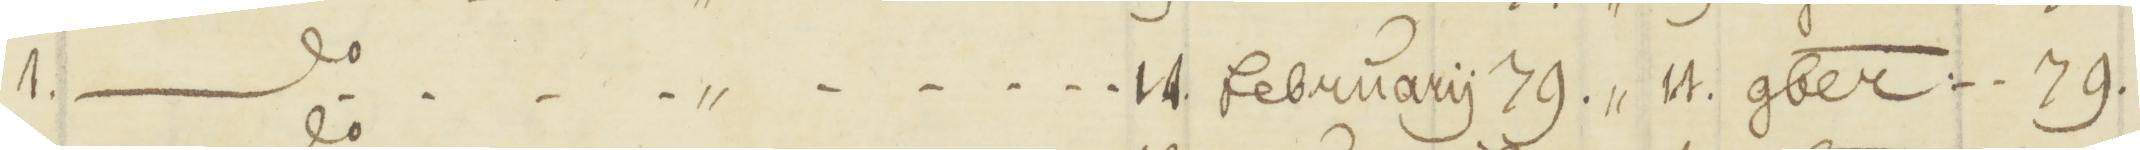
1. _o.....„....14. februarij 79. „ 11. gber: 79:
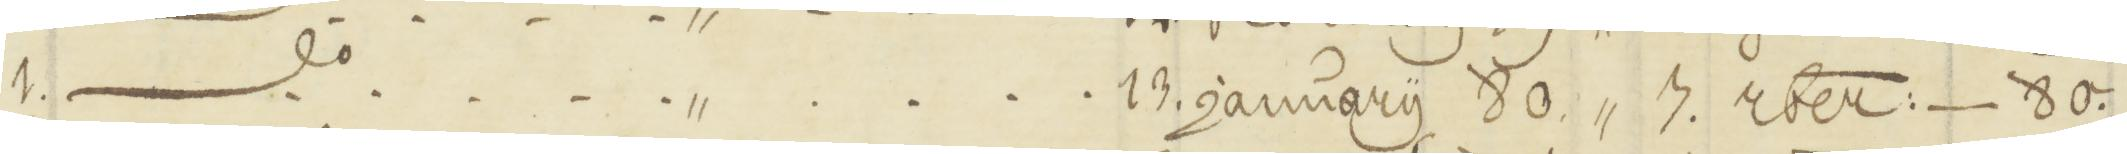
1. _o.....„....13. januarij 80: „ 7. rber: — 80.
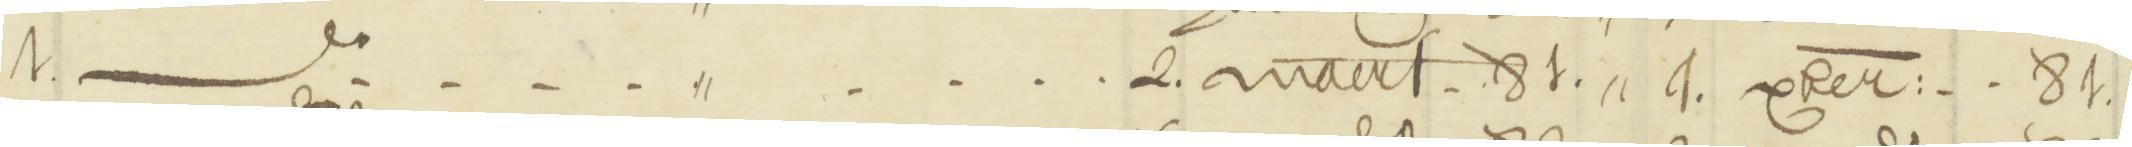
1. _o.....„....2. maert. 81.„ 4. xber:... 81
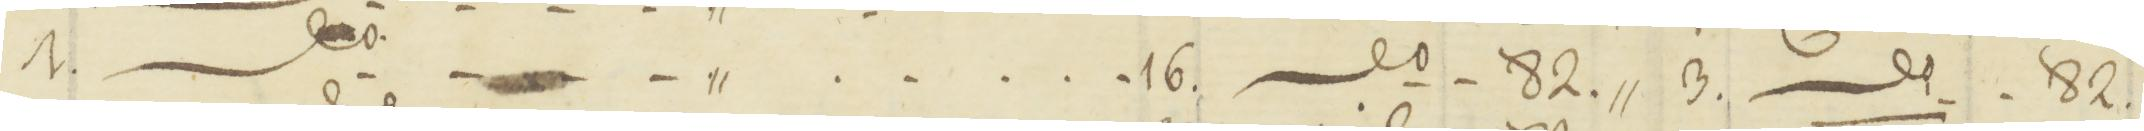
1. _o.....„....16. _o - 82. „ 3. _o 82.
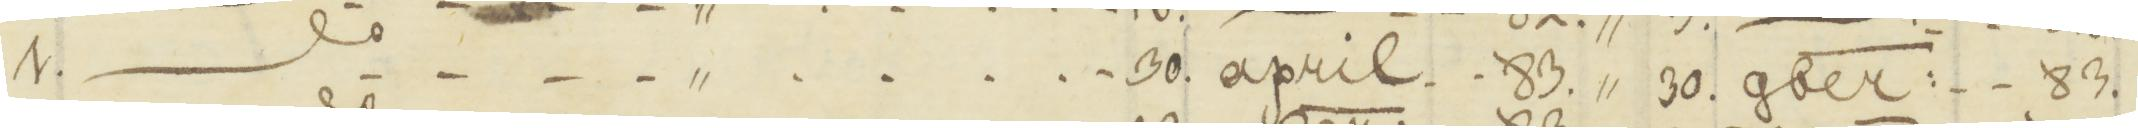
1. _o.....„....30. april 83. „ 30. gber: 83.
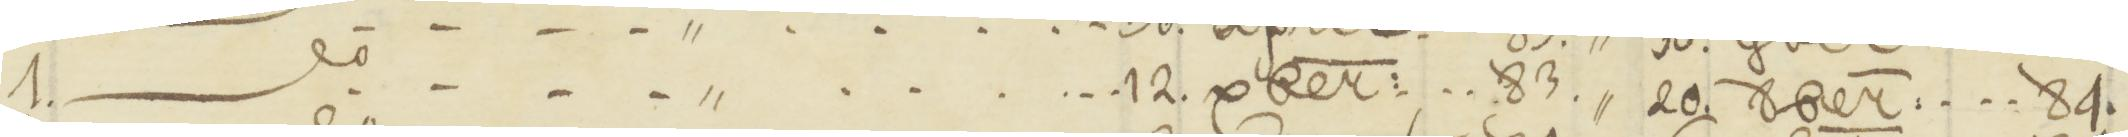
1. _o.....„....12. xber: 83 „ 20. 8ber:... 84.
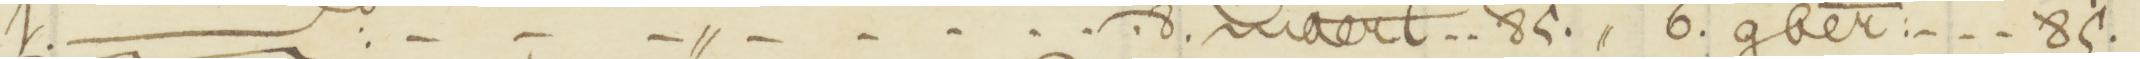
1. _o.....„....8. maert. 85. „ 6. gber:... 85.
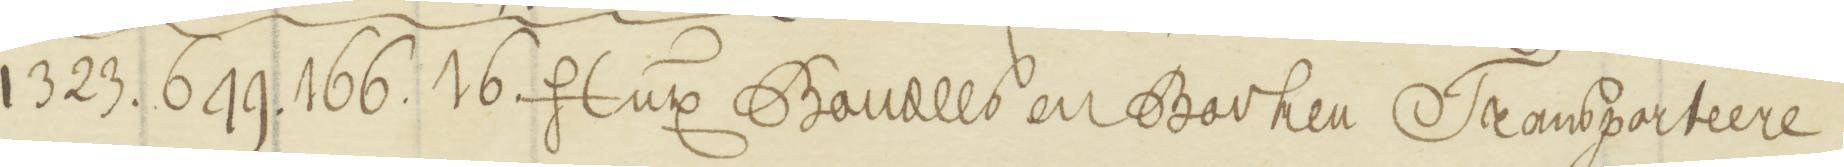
1323. 649.166. 16. stux Bondels en Boeken Transporteere
